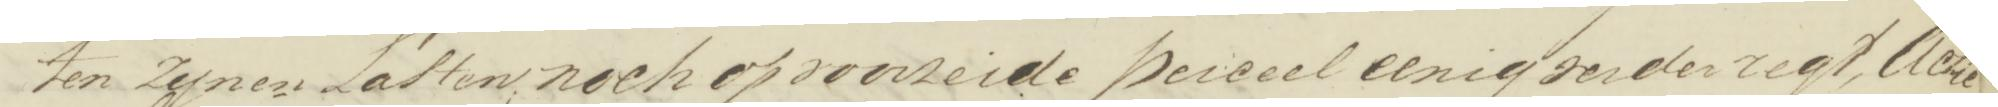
ten zynen Lasten noch op voorzeide perceel eenig verder regt, Actie
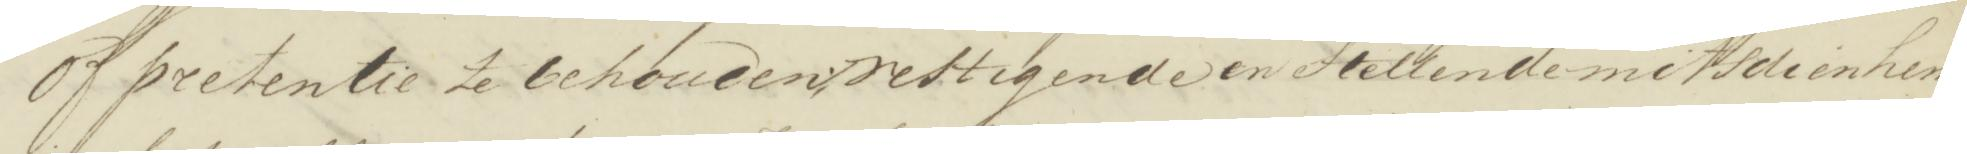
of pretentie te behouden, vestigende en stellende mitsdien hem
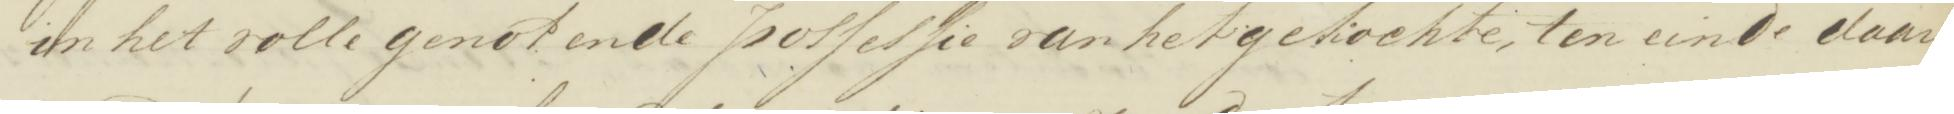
in het volle genot ende possessie van het gekochte, ten einde daar
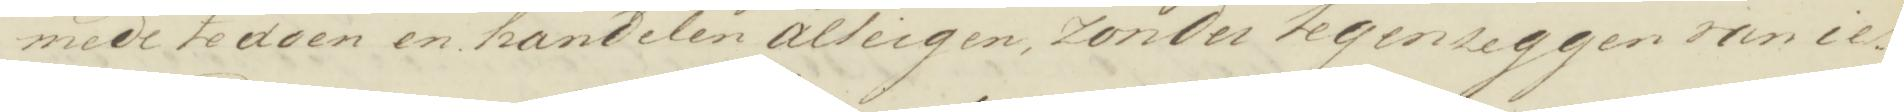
mede te doen en handelen als eigen, zonder tegenzeggen van ie„
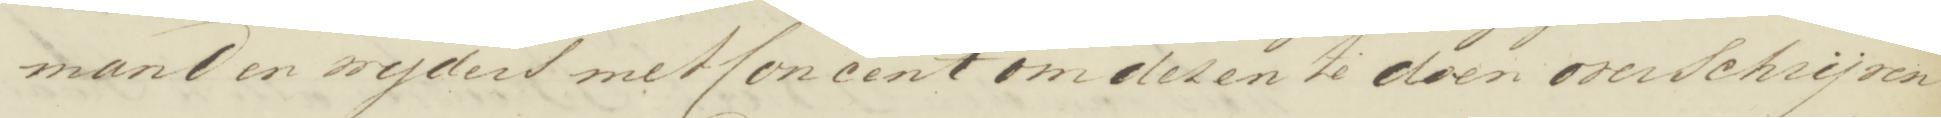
mand en wyders met Concent om dezen te doen overschrijven
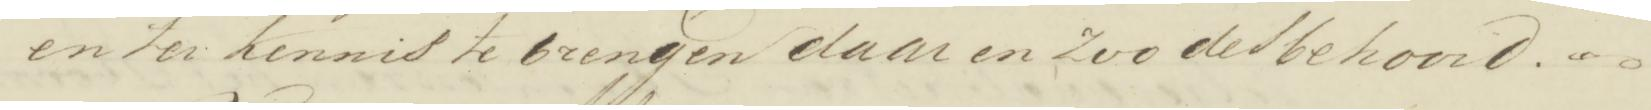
en ter kennis te brengen daar en zooals behoord.
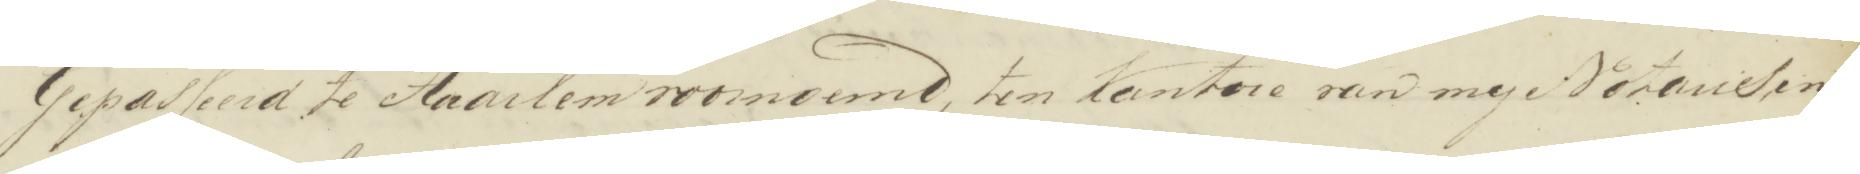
Gepasseerd te Haarlem voornoemd, ten kantore van my Notaris, in
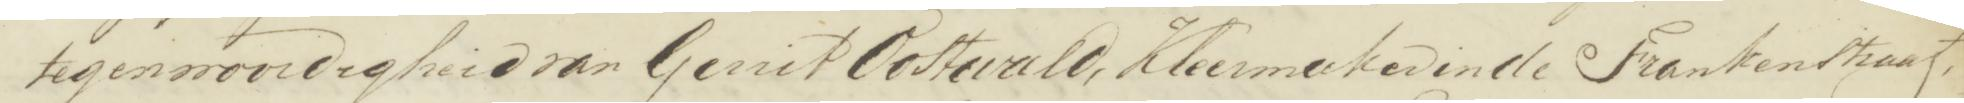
tegenwoordigheid van Gerrit Oostwald, Kleermaker in de Frankenstraat,
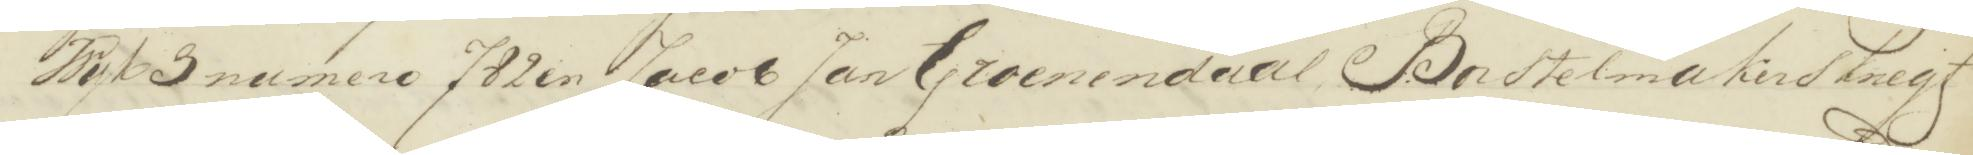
Wyk 3 numero 782 en Jacob Jan Groenendaal Borstelmakersknegt
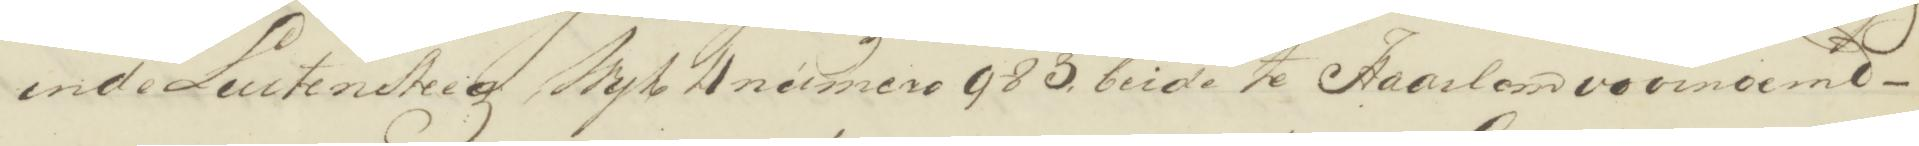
inde Luitensteeg, Wyk 4 numero 983, beide te Haarlem voornoemd -
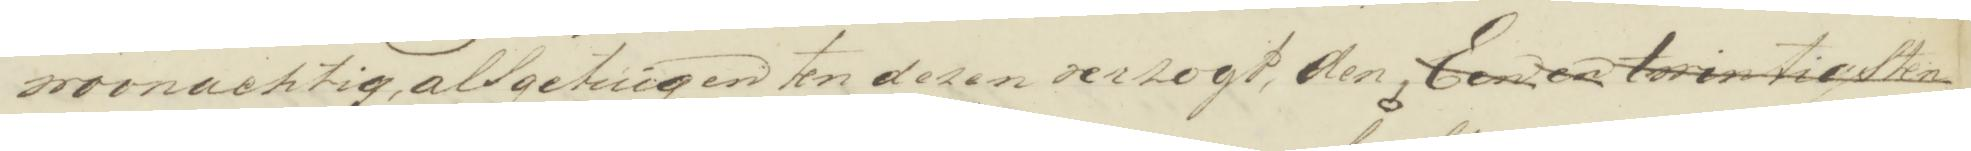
woonachtig, als getuigen ten dezen verzogt, den ¶ Een en twintigsten
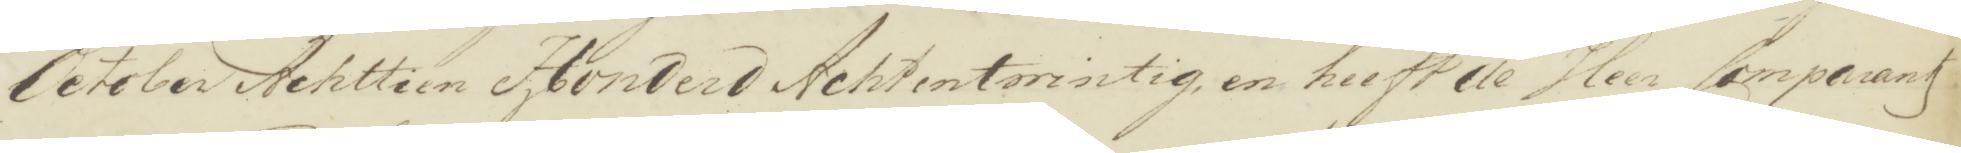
October Achttien Honderd Achtentwintig, en heeft de Heer Comparant
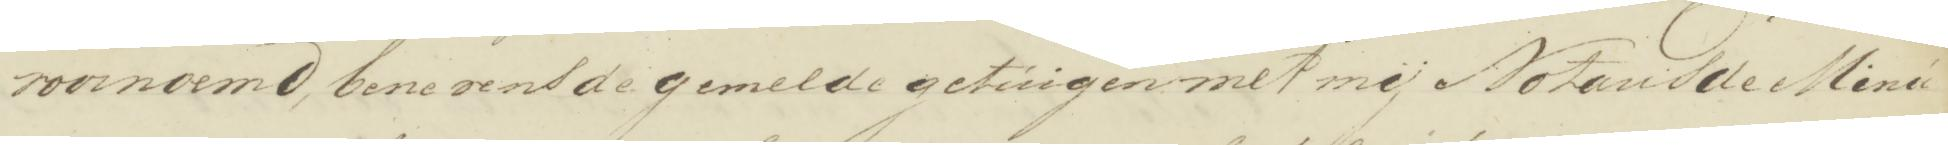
voornoemd, benevens de gemelde getuigen met mij Notaris de Minu
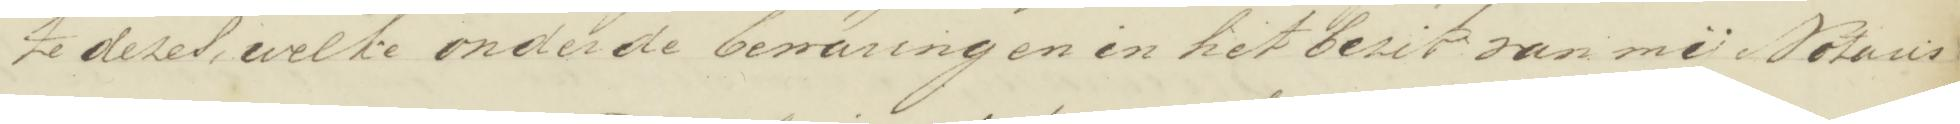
te dezes, welke onder de bewaring en in het bezit van mij Notaris
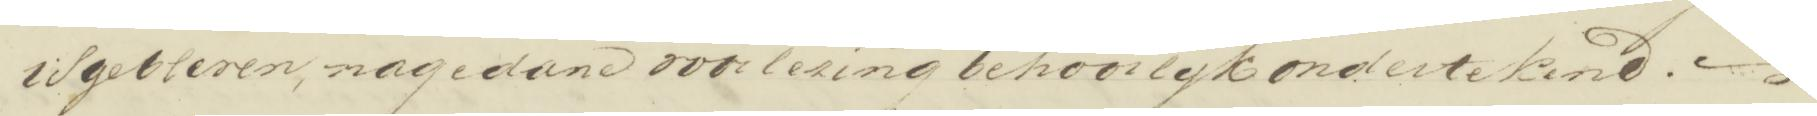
is gebleven, nagedane voorlezing behoorlyk ondertekend.
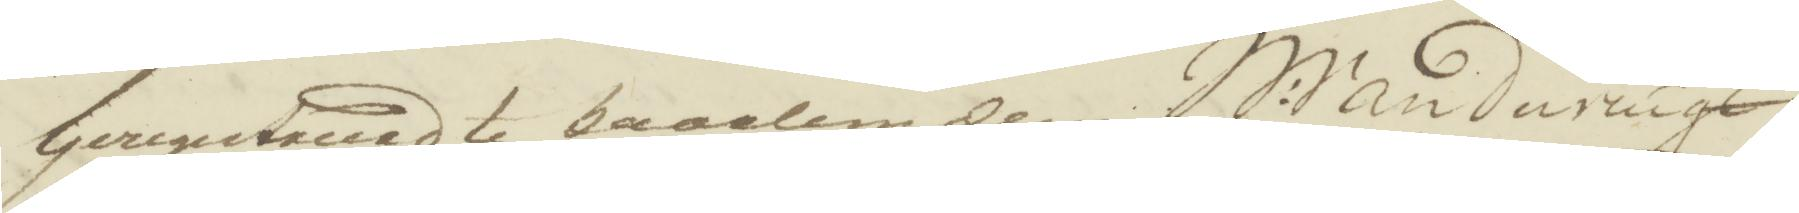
Geregistreerd te haarlem den M:Van der vlugt
